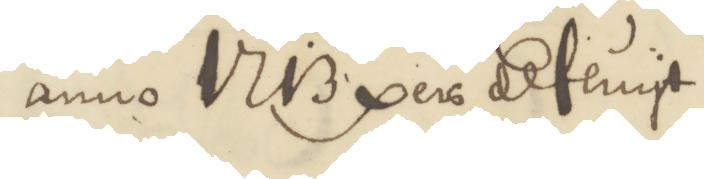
anno 1713 per de fluijt
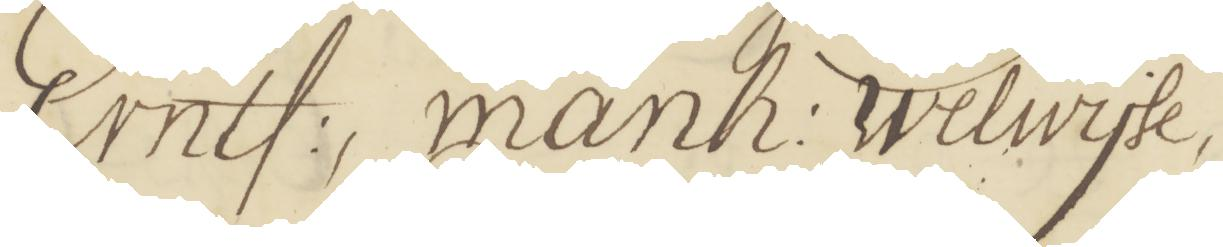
Erntf:, manh: welwijse,
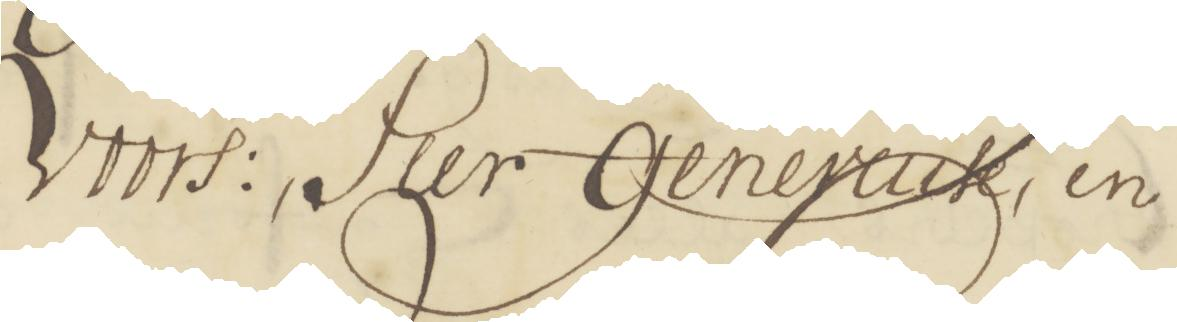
voors:, seer genereuse, en
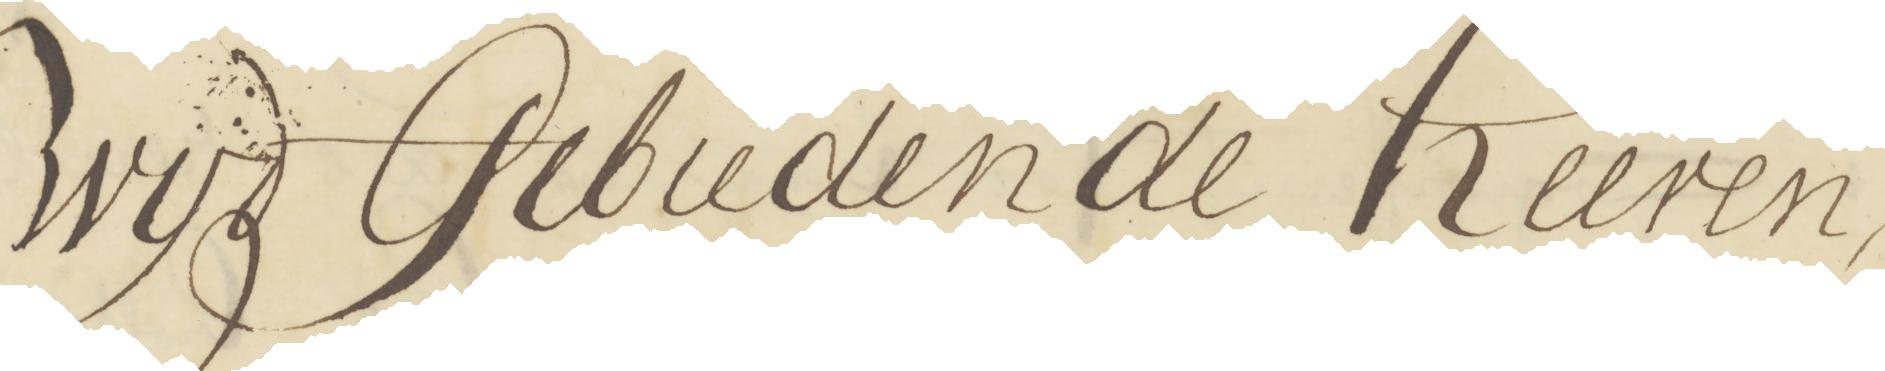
Wijd Gebiedende heeren,
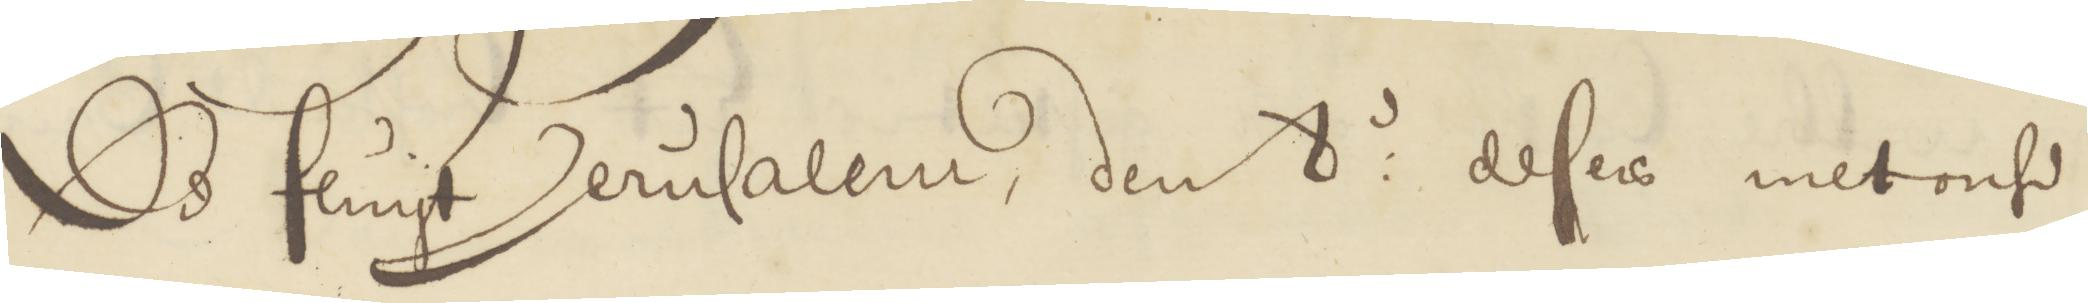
De fluijt Jerusalem, den 8:e deser met onse
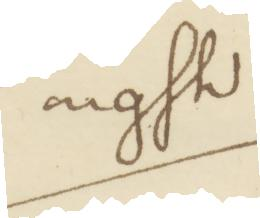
ongste
